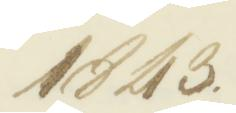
1843.
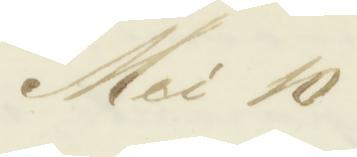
Mei 10
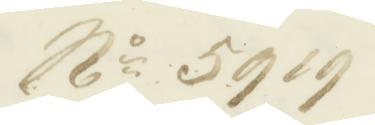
N=o 5919
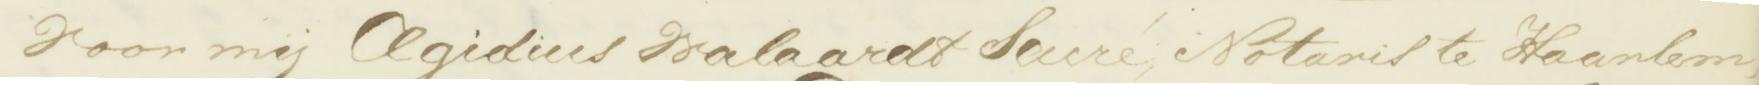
Voor mij Aegidius Walaardt Sacré, Notaris te Haarlem
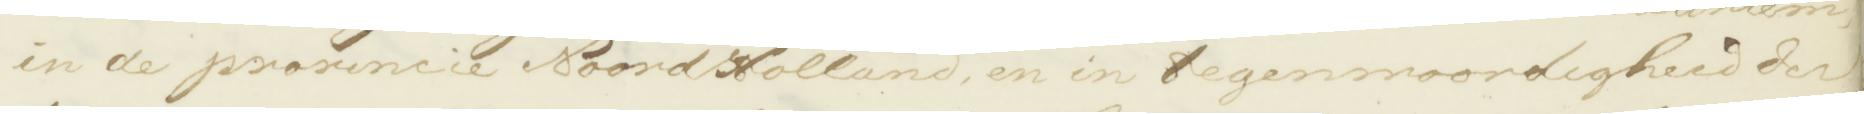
in de provincie Noord Holland, en in tegenwoordigheid der
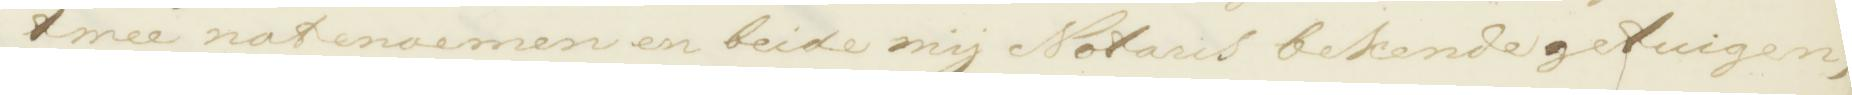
twee natenoemen en beide mij Notaris bekende getuigen
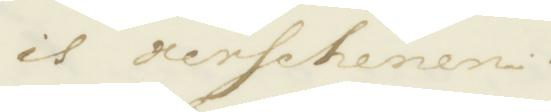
is verschenen:
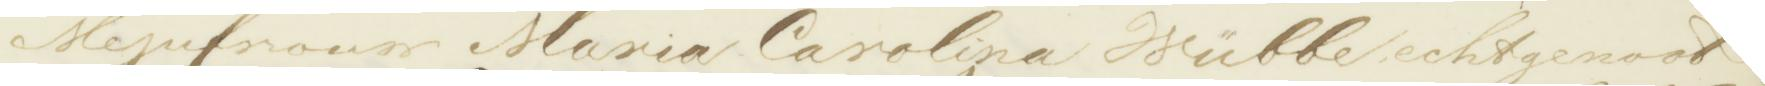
Mejufrouw Maria Carolina Wübbe echtgenoot
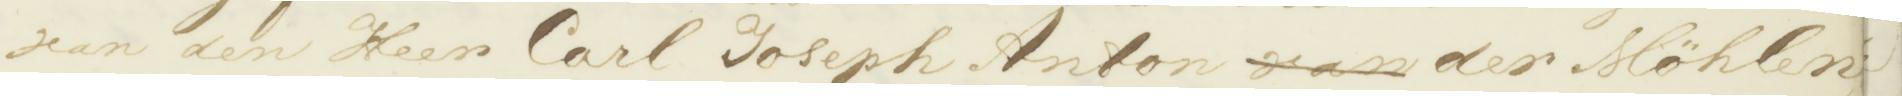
van den Heer Carl Ioseph Anton van der Möhlen
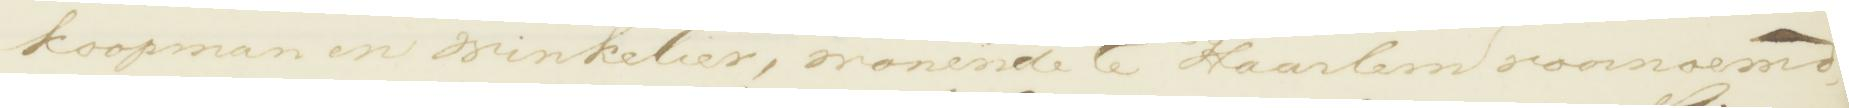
koopman en winkelier, wonende te Haarlem voornoemd,
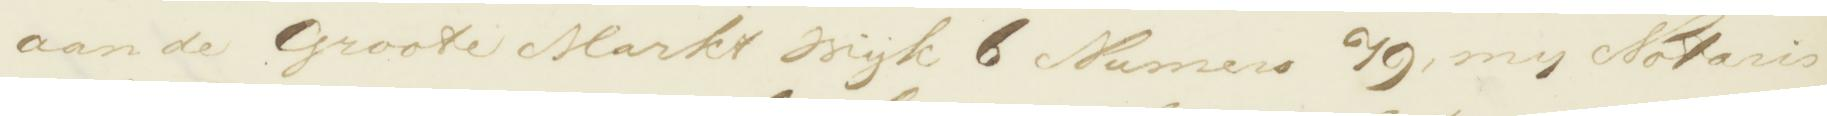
aan de Groote Markt Wijk 6 Numero 79, my Notaris
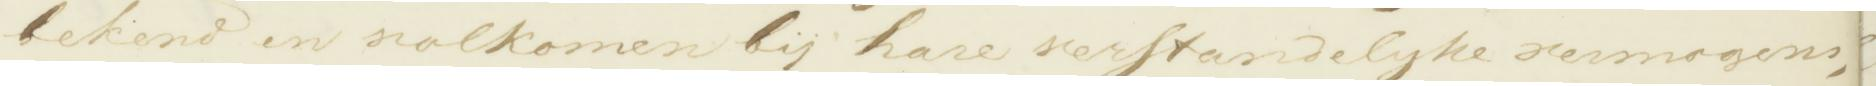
bekend en volkomen bij hare verstandelyke vermogens,
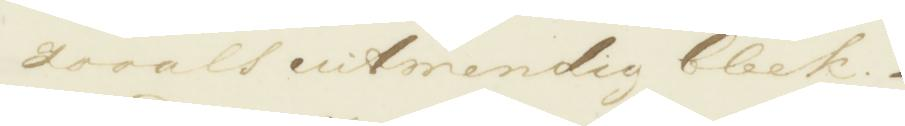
zoo als uitwendig bleek.
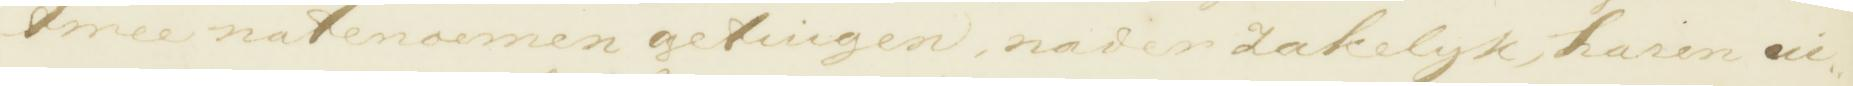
twee natenoemen getuigen, nader zakelyk, haren ui„
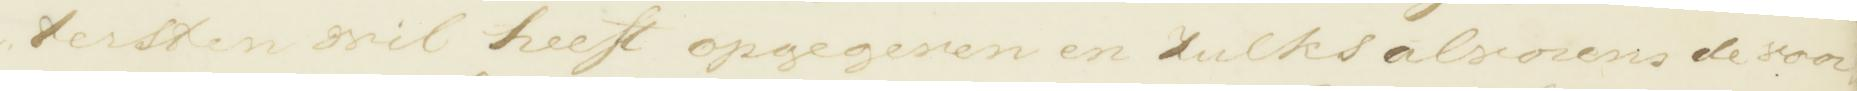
„tersten wil heeft opgegeven en zulks alvorens de voor
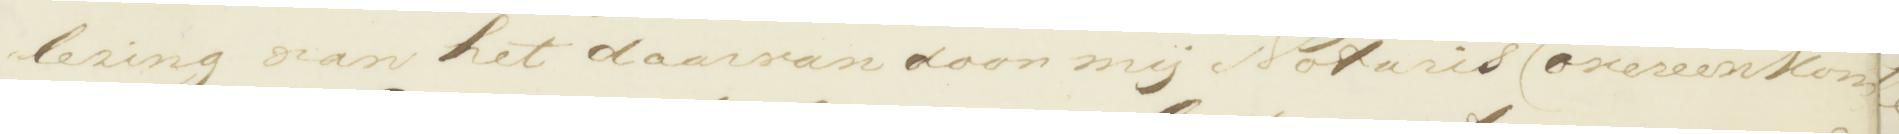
„lezing van het daarvan door mij Notaris (overeenkon,
